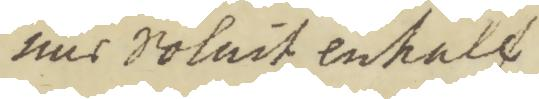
uur voluit en half
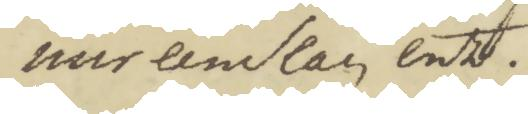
uur een slag enz.
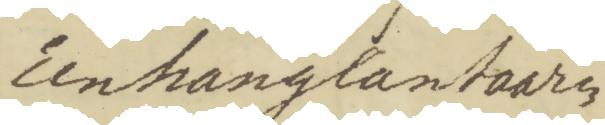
Een hanglantaarn
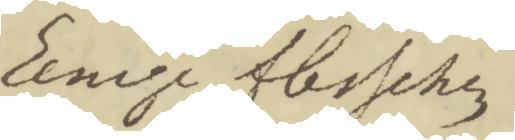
Eenige flesschen
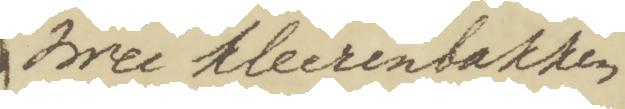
Twee kleerenbakken
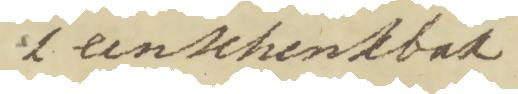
1 een schenkbak
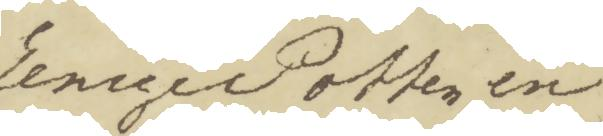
Eenige Potten en
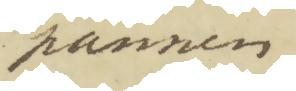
pannen
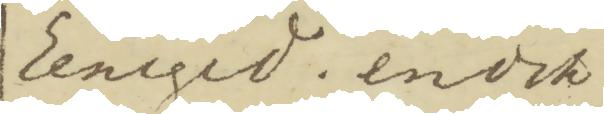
Eenige d. en dito
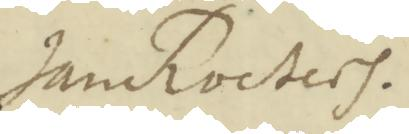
Jan Roeters.
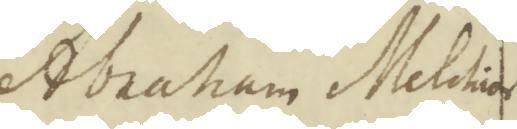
Abraham Melchior
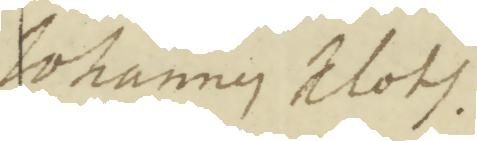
Johannes klots.
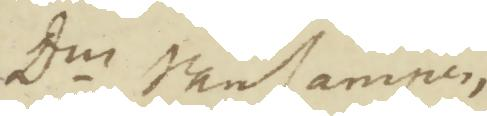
D-m van Campen
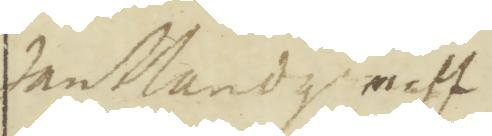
Jan Mandy mess
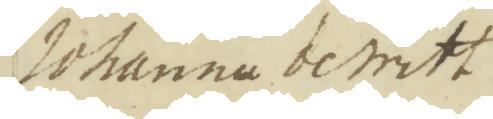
Johanna de Witt
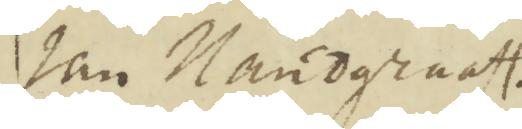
Jan Van 'd Graaff.
